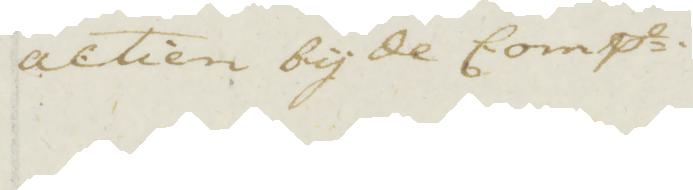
actien bij de Comp=e
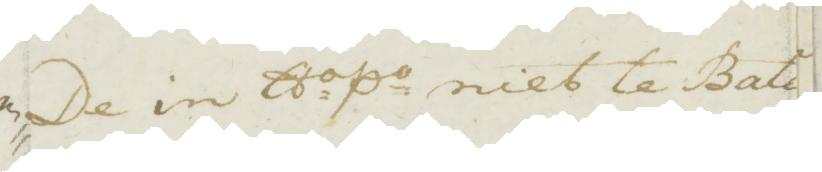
De in A=o P=o niet te Bata
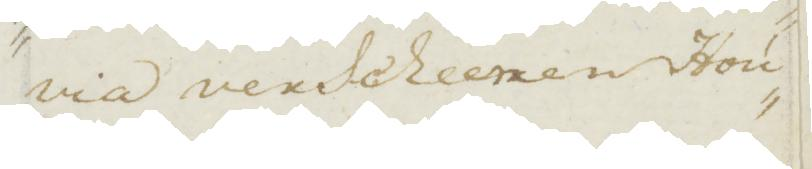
„via verscheenen Han„
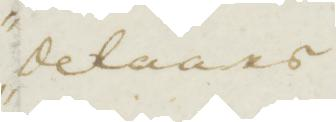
delaars
